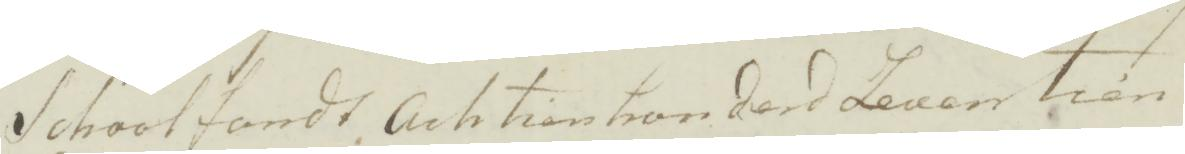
Schoolfonds, Achtien honderd Zeventien
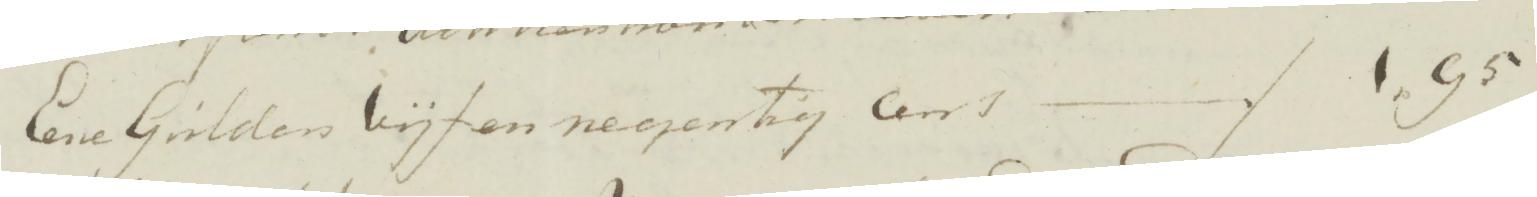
Eene Gulden vijf en negentig Cent ƒ 1„95
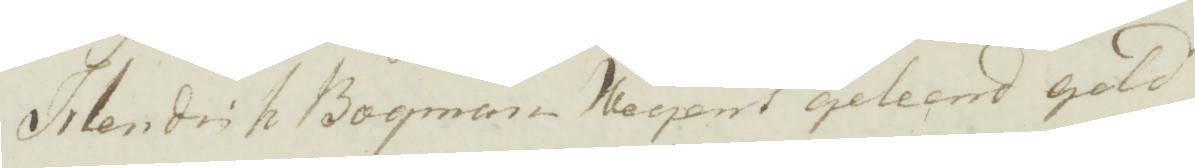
Hendrik Bogman Wegens geleend geld
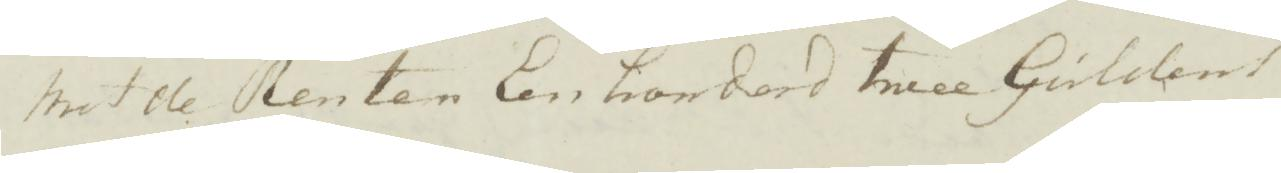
met de Renten Een honderd twee Guldens
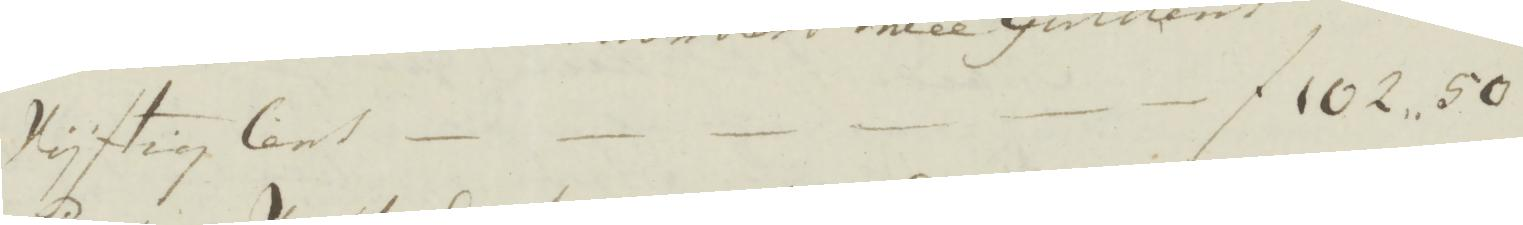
Vijftig Cent ƒ 102„50
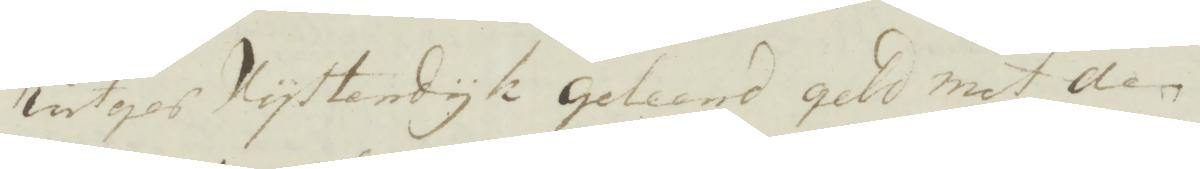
Rutger Vijstendijk geleend geld met den
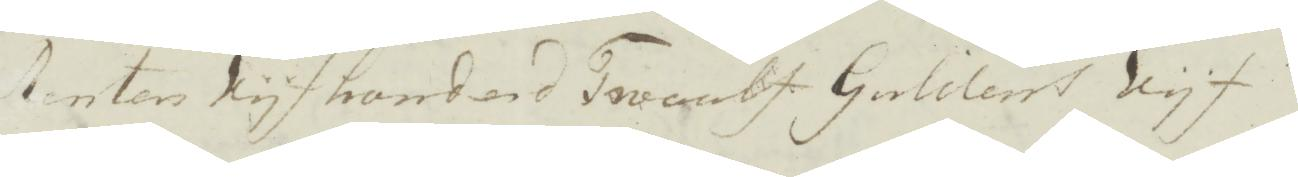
Renten Vijfhonderd Twaalf Guldens Vijf
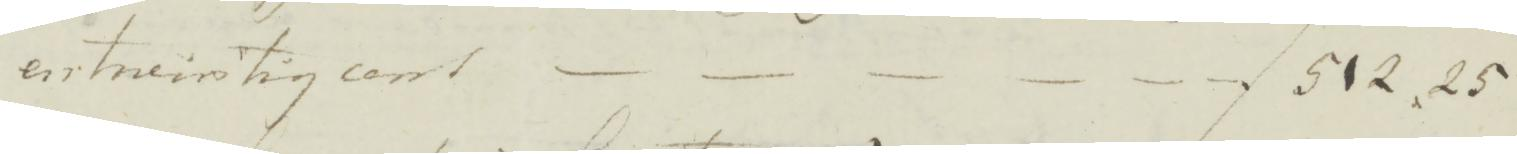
en twintig cent— — — — — — 512„25
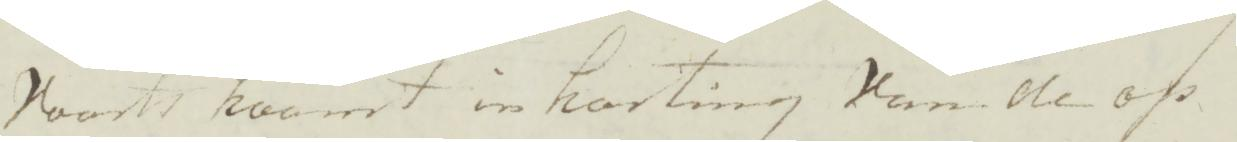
Voorts koomt in korting Van de op
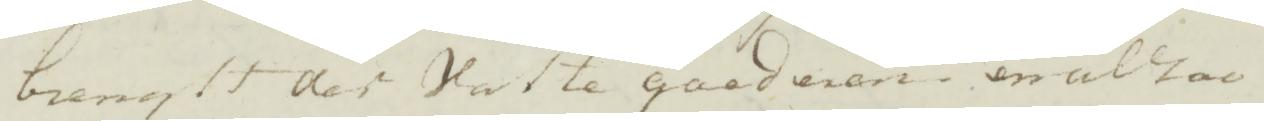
brengst der Vaste goederen en alzoo
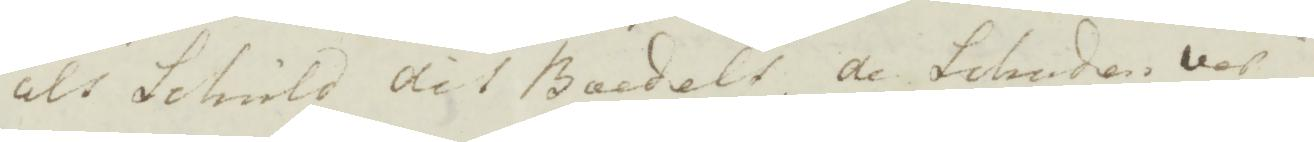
als Schuld dès Boedels, de Schuden ver
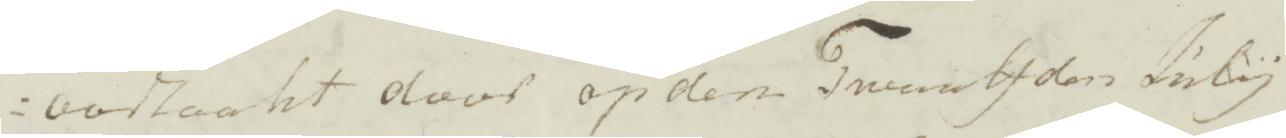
=oorzaakt door op den Twaalfden Iulij
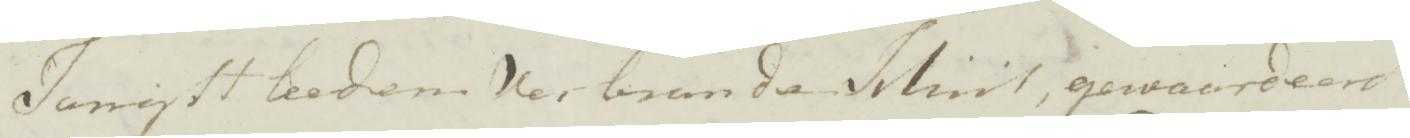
Jongst leeden Verbrande Huis, gewaardeerd
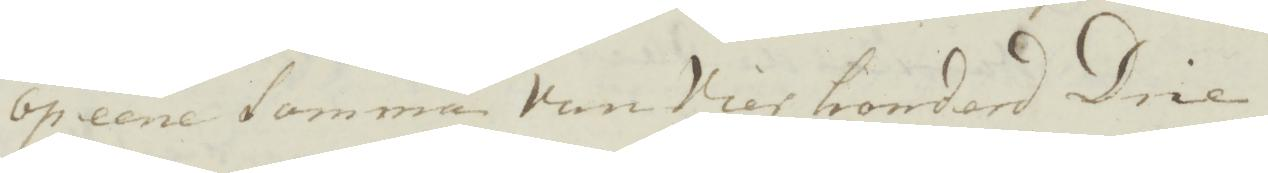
op eene Somma van Vier honderd Drie
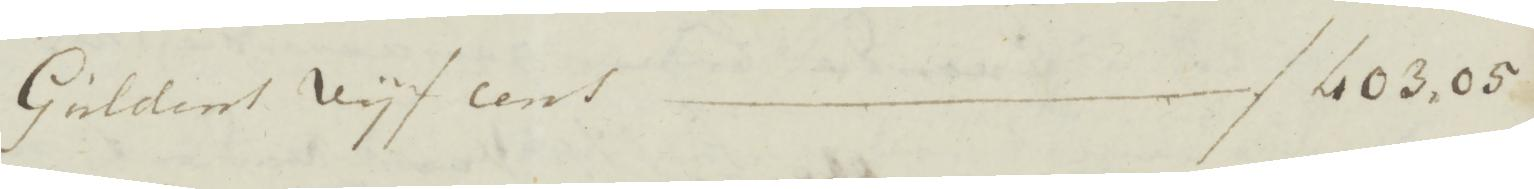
Guldens vijf cens ƒ 403„05
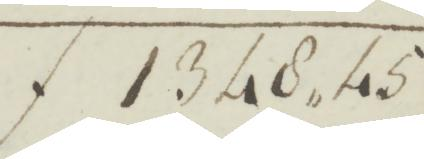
ƒ 1348„45
